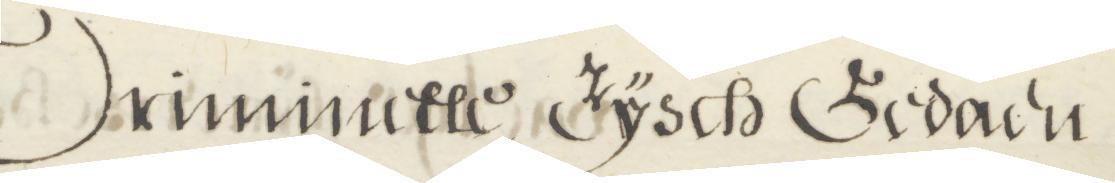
Crimneele Eijsch Gedaen
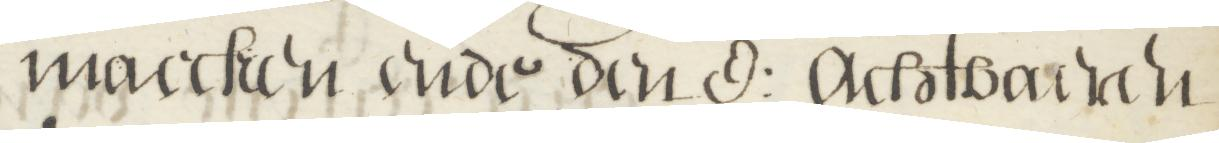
maecken ende den E: Achtbaeren
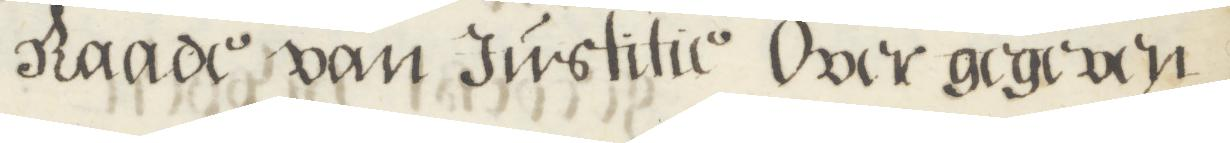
Raade van Iustitie Over gegeven
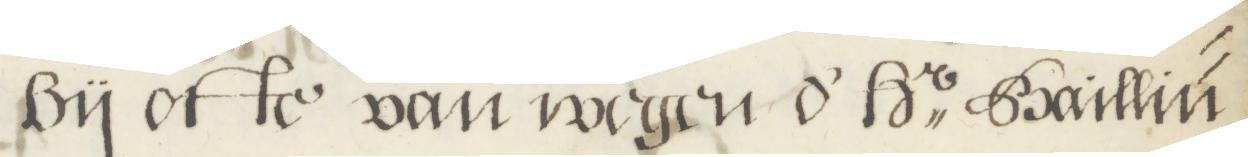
bij ofte van wegen d’ h„r Bailliu
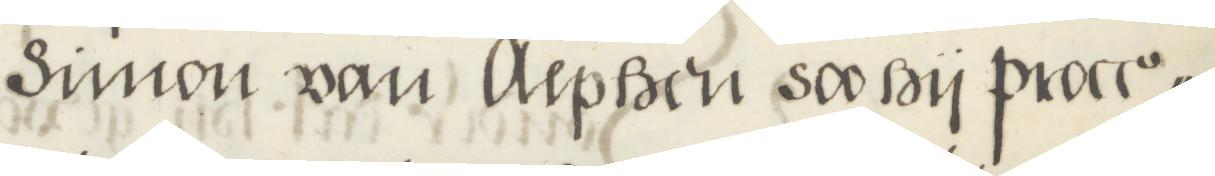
Simon van Alphen soo hij proce„
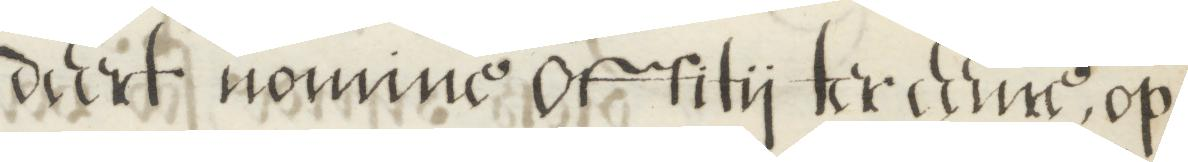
deert nomine offitij ter eene, op
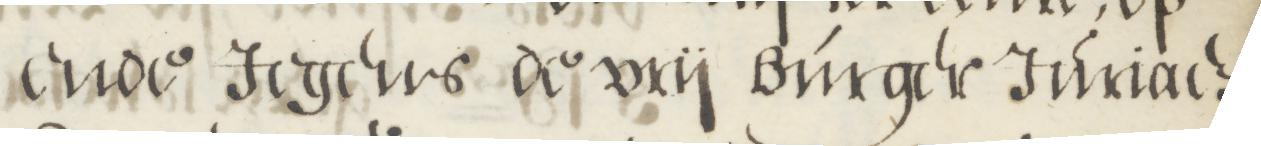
ende Iegens de vrij burgers Iuriaen
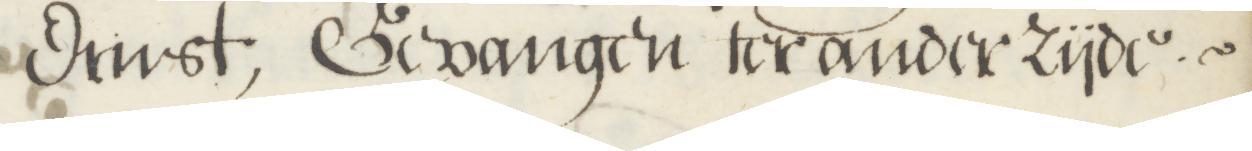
Ernst, Gevangen ter ander zijde.
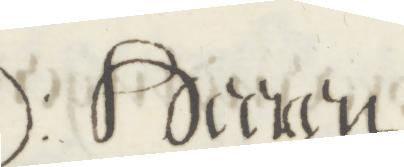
E: heeren
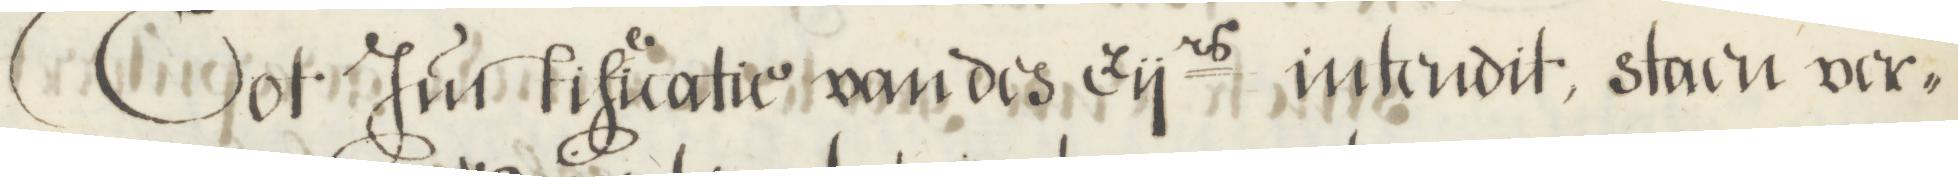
Tot Justificatie van des Eij=rs intendit, staen ver„
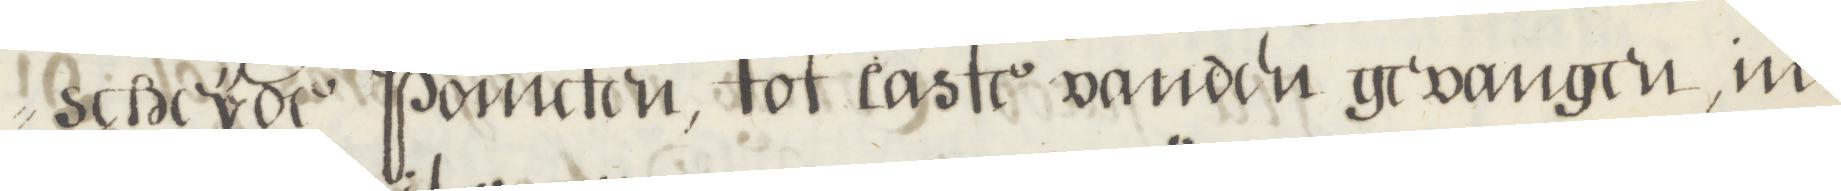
„scheijde poincten, tot laste vanden gevangen, in
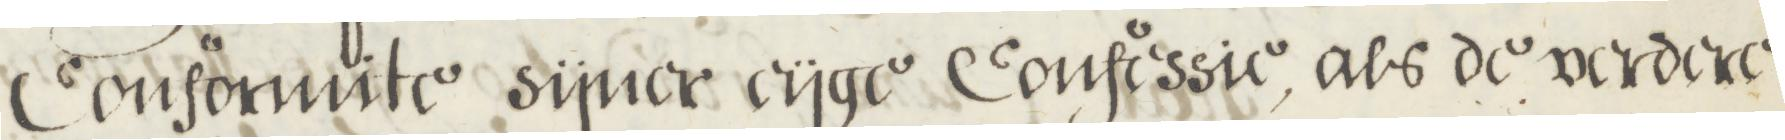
Conformite sijner eijge Confessie, als de verdere
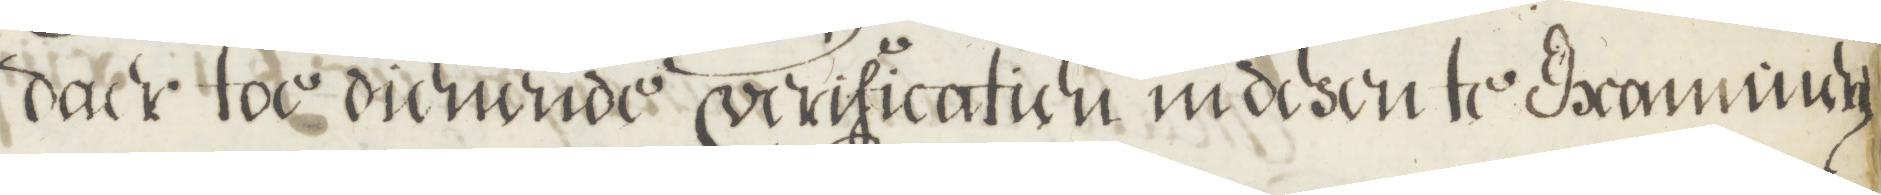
daer toe dienende Certificatien in desen te Examineren
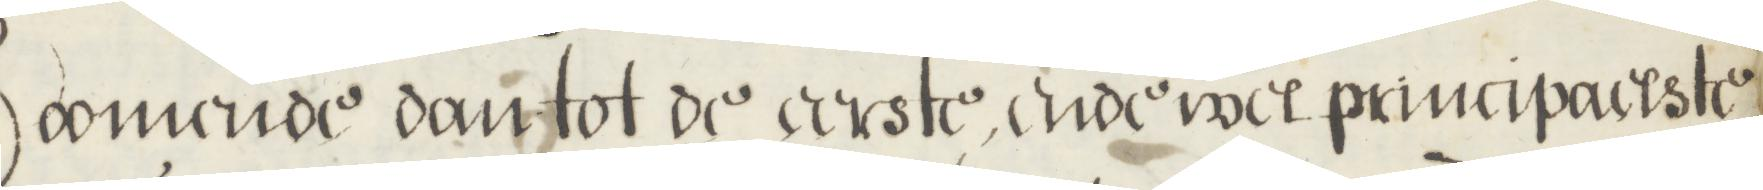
Coomende dan tot de eerste, ende wel principaelste
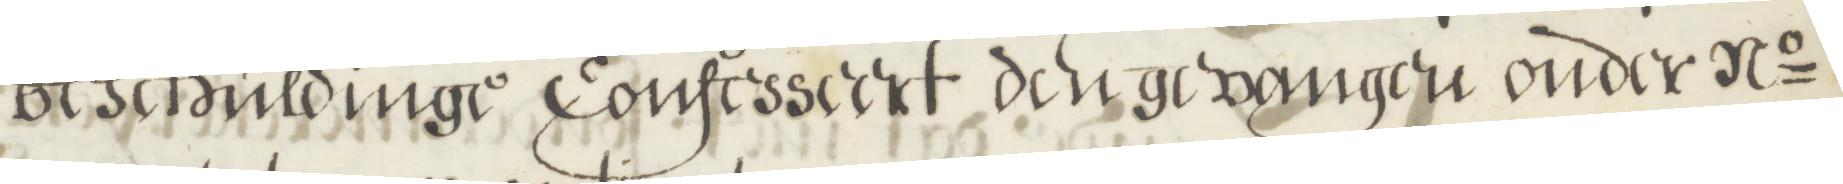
beschuldinge Confesseert den gevangen onder N=o
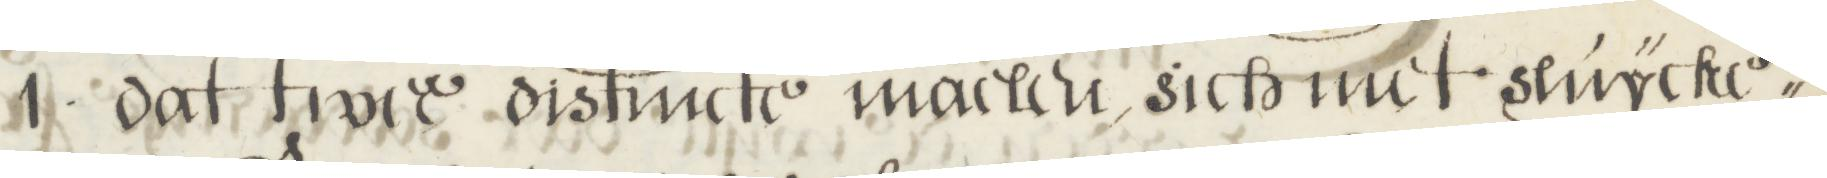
1. dat twee distincte maelen, sich met sluijcke„
